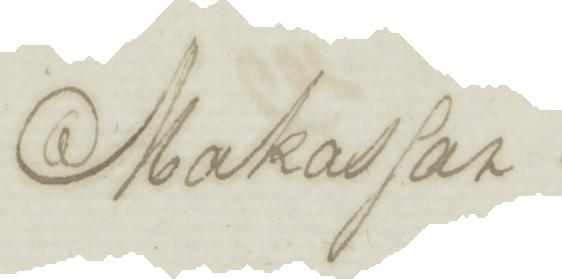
Makassar
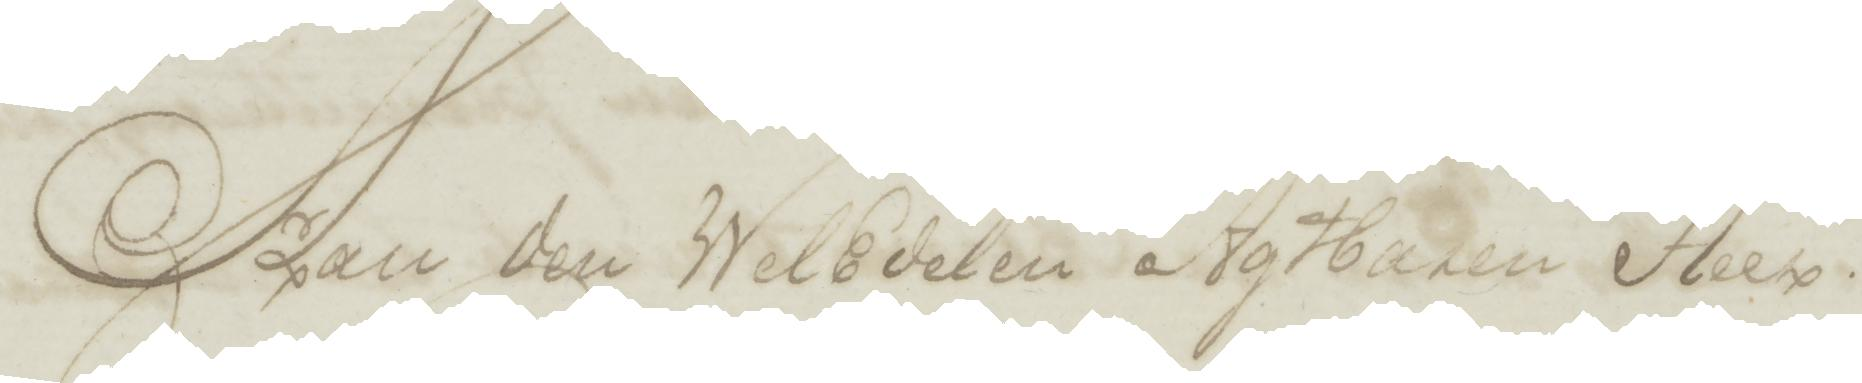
Aan den WelEdelen Agtbaren Heer
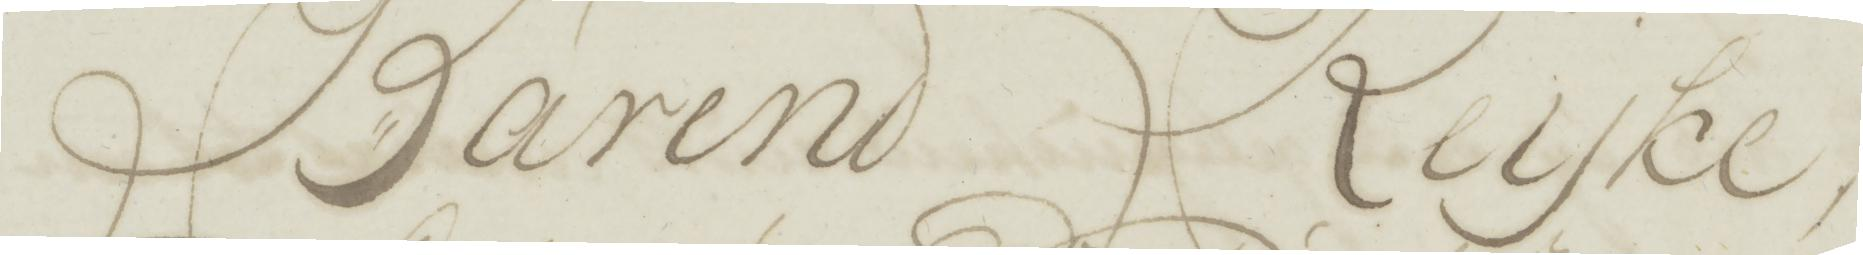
Barend Reijke,
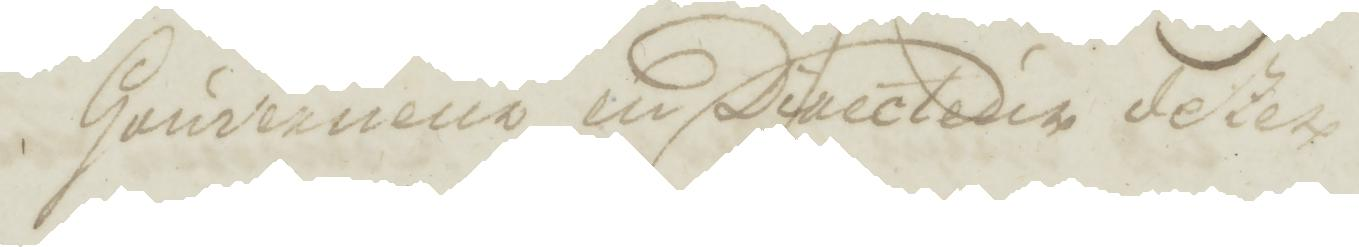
Gouverneur en Dircecteur dezer
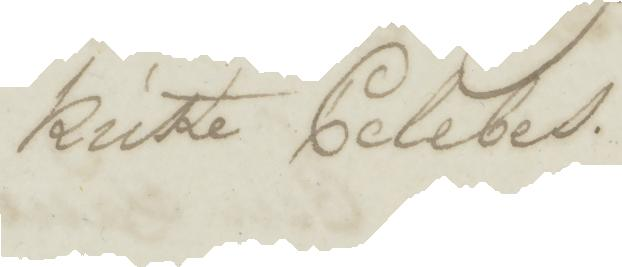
kuste Celebes.
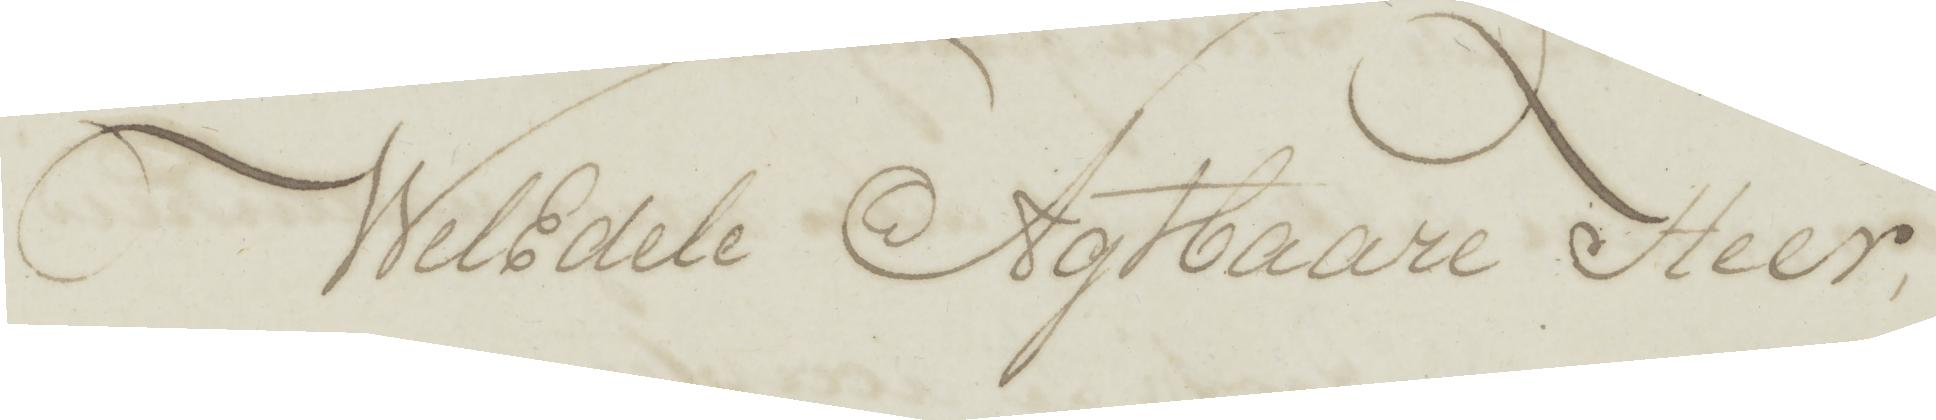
WelEdele Agtbaare Heer
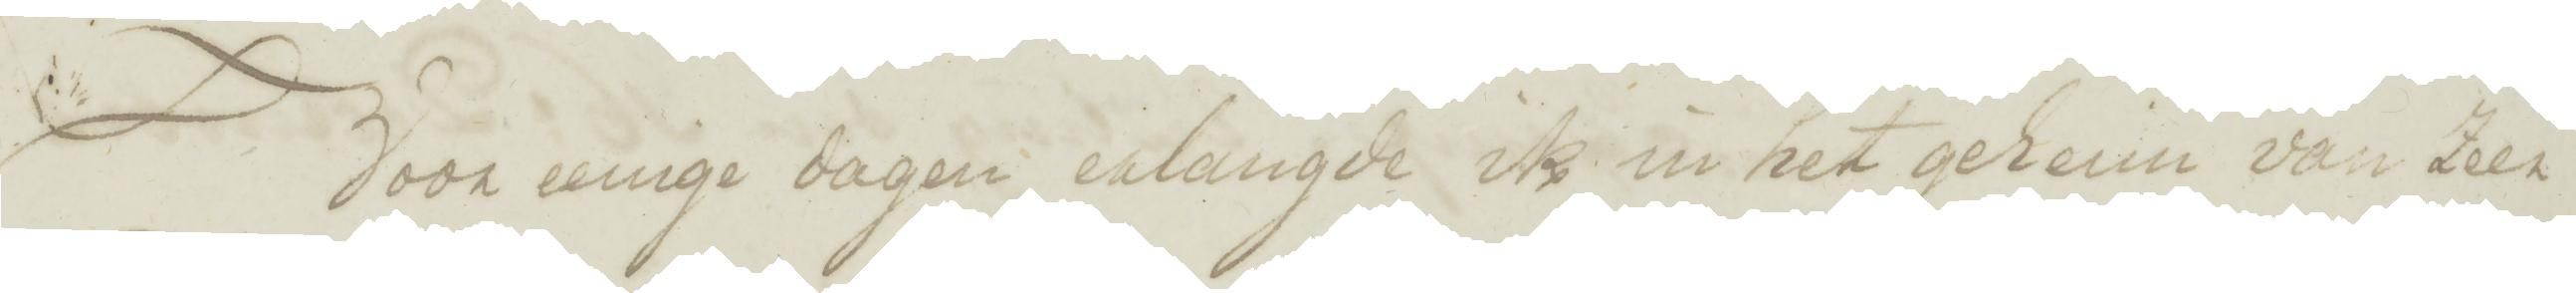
Voor eenige dagen erlangde ik in het geheim van zeer
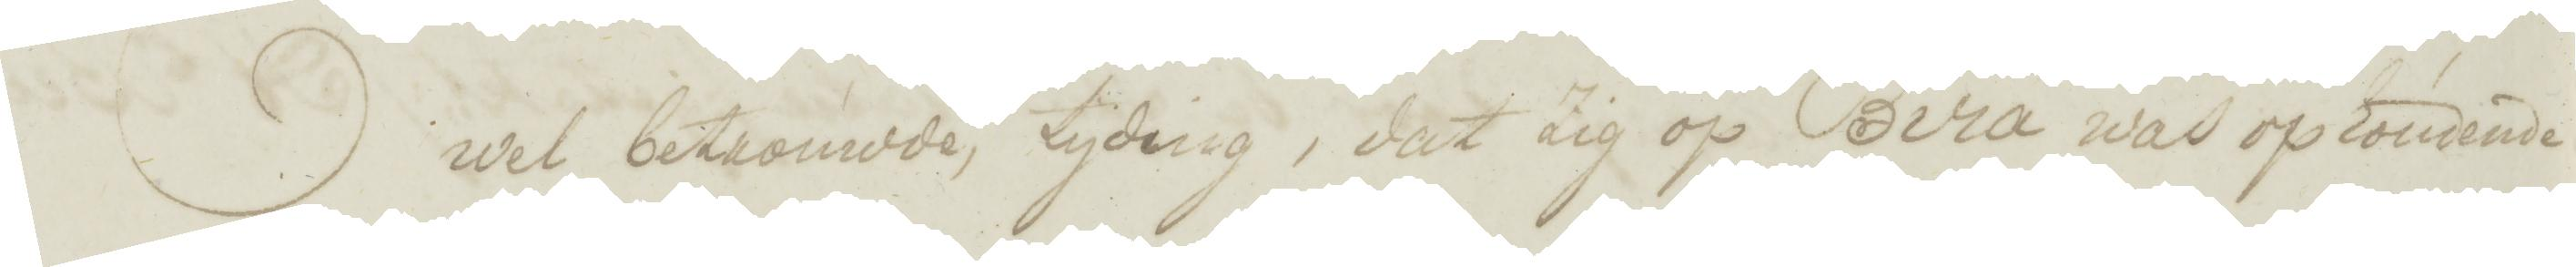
wel betrouwde, tijding, dat zig op Bira was op houdende
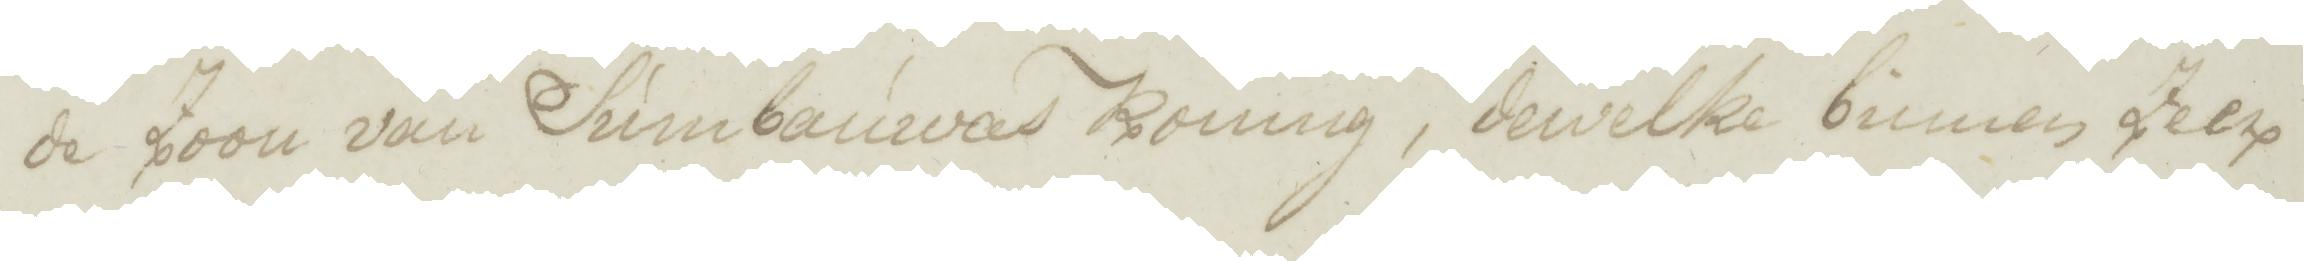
de Zoon van Sumbauwas koning, dewelke binnen zeer
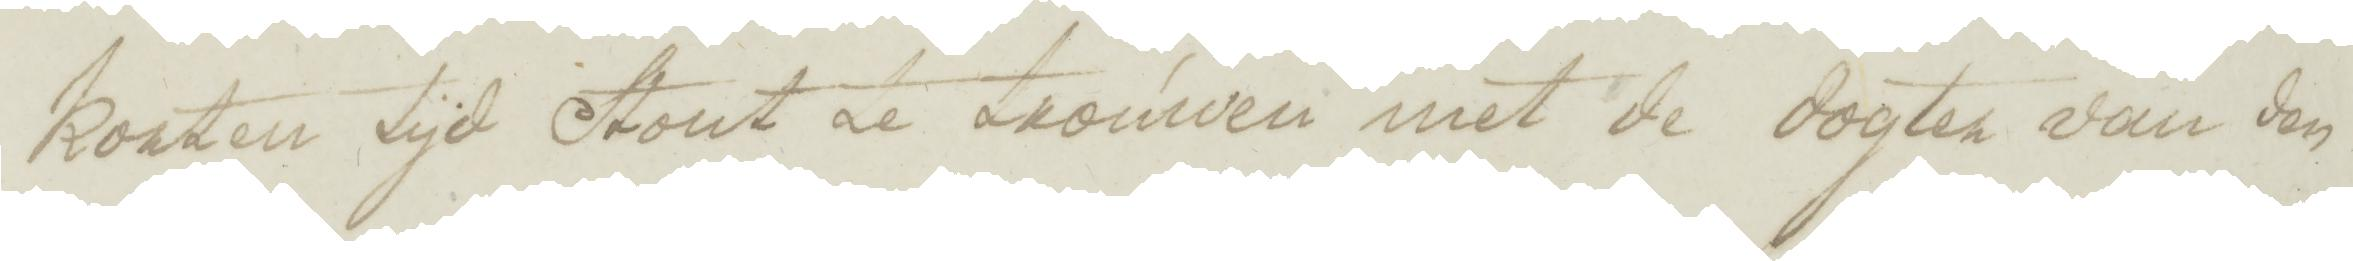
korten tijd stont te trouwen met de dogter van den
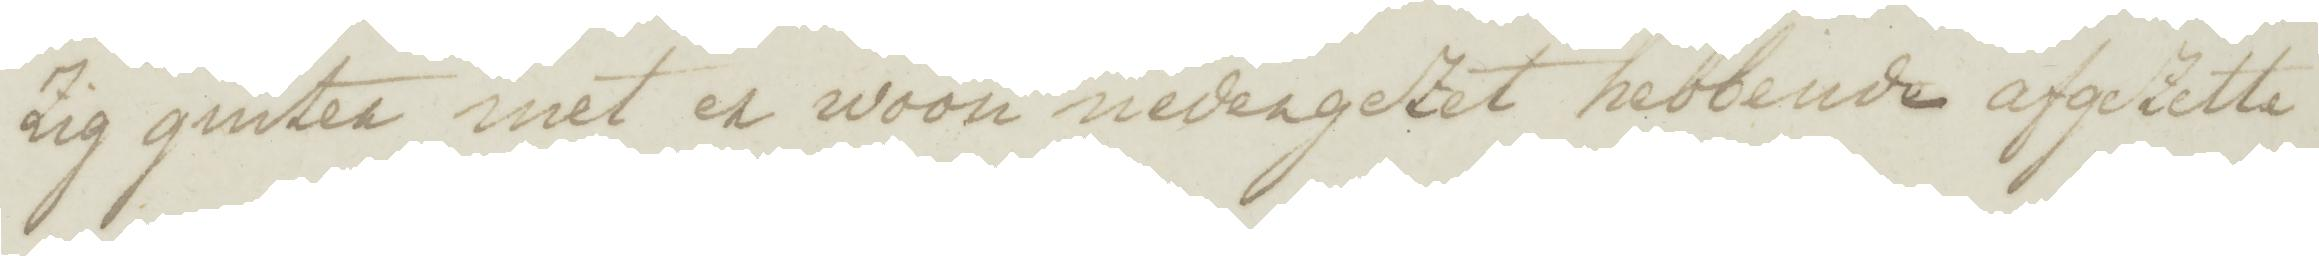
zig ginter met er woon nedergezet hebbende afgezette
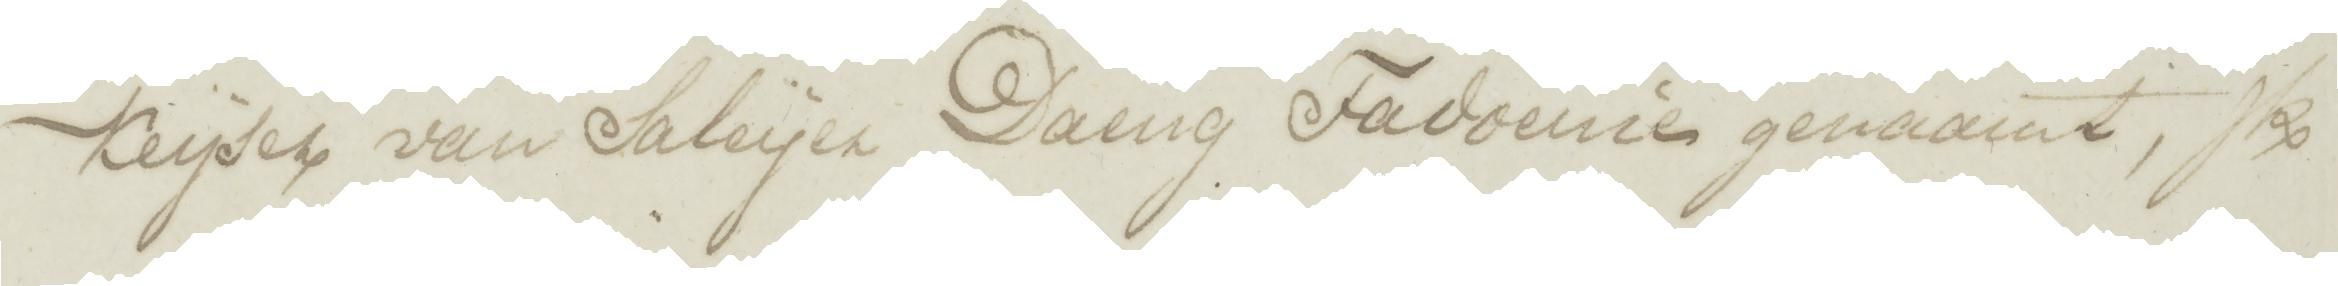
keijser van Saleijer Daeng Fadoenie genaamt, jk
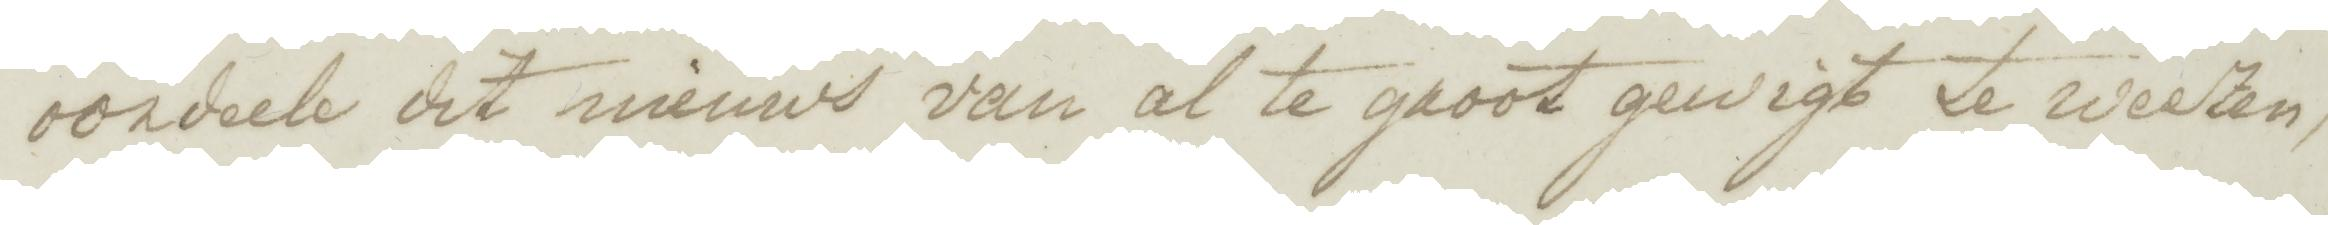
oordeele dit nieuws van al te groot gewigt te weezen,
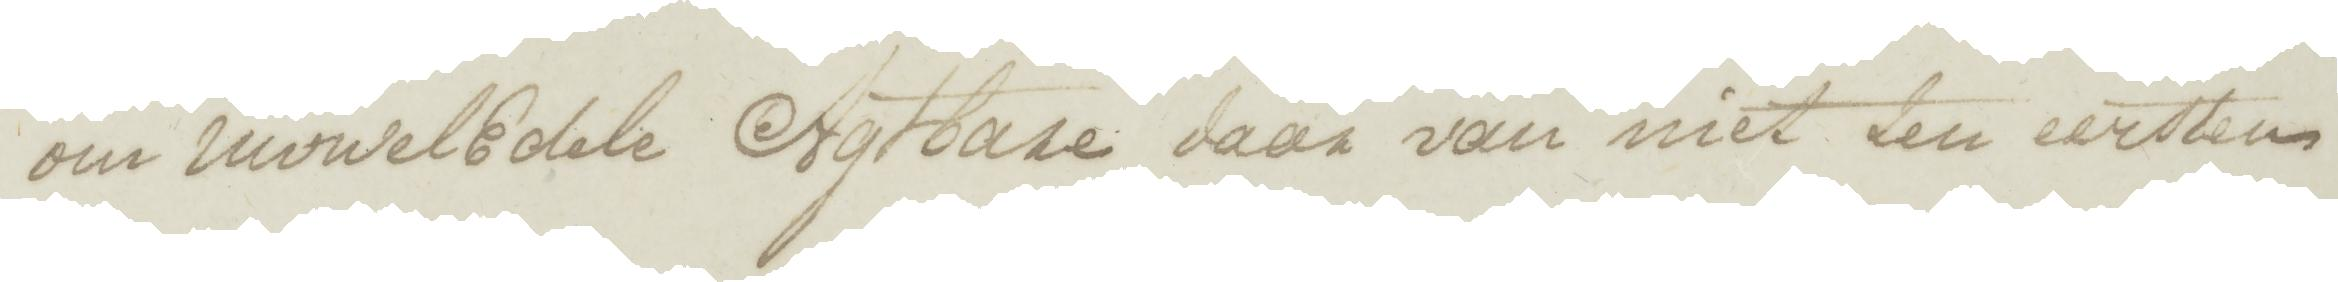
om uw wel Edele Agtbare daar van niet ten eersten
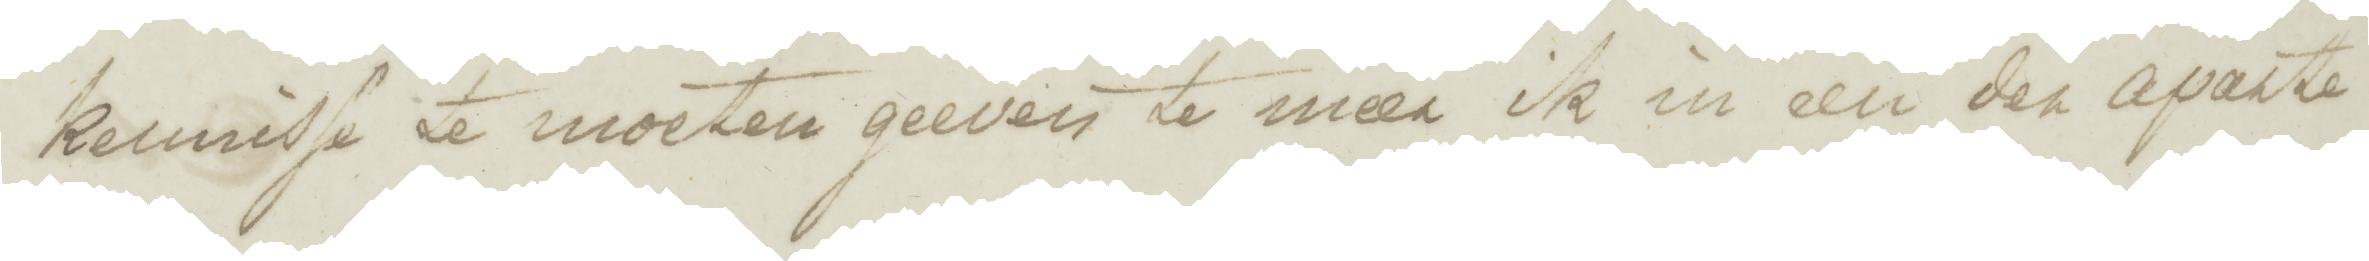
kenisse te moeten geeven te meer ik in een der aparte
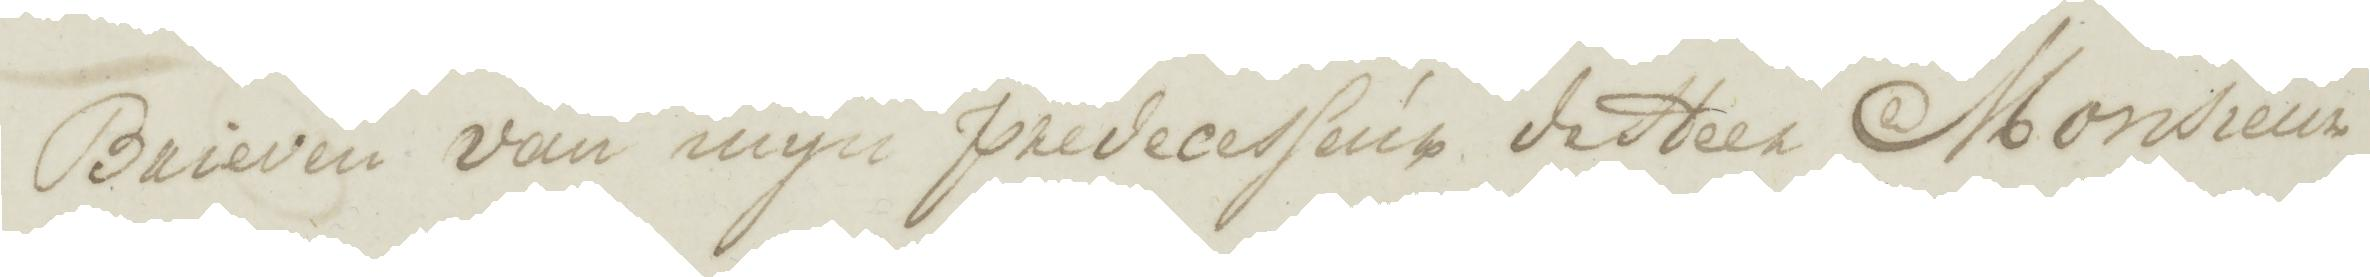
Brieven van mijn predecesseur de Heer Monsieur
